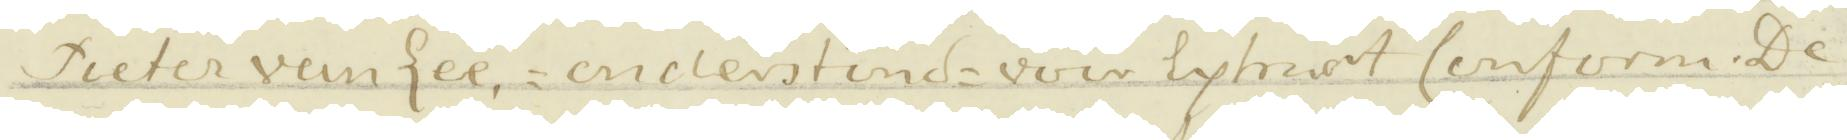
Pieter van Lee, = onder stond = voor Extract Conform. De
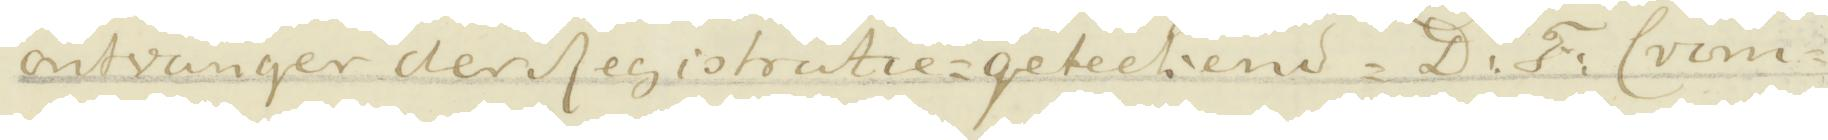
ontvanger der Registratie = geteekend = D: F: Crom=
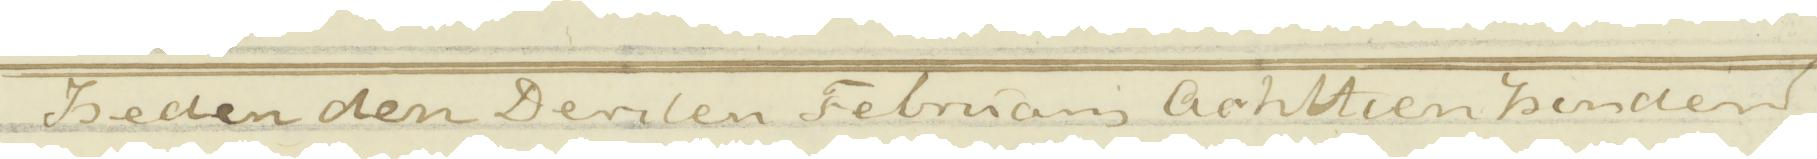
Heden den Derden Februarij Achttien honderd
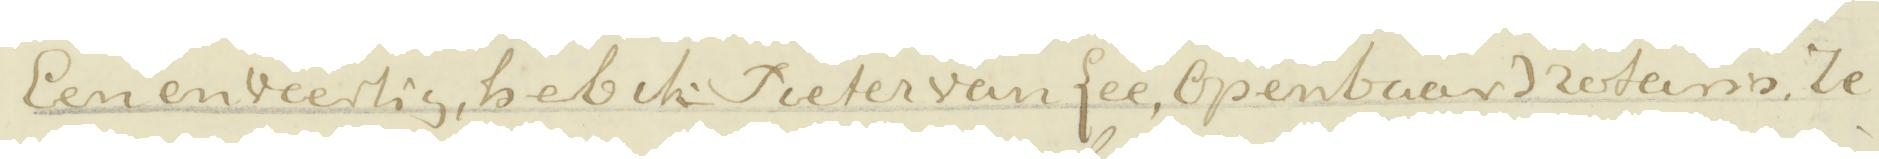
Een en veertig, heb ik Pieter van Lee, Openbaar notaris, re
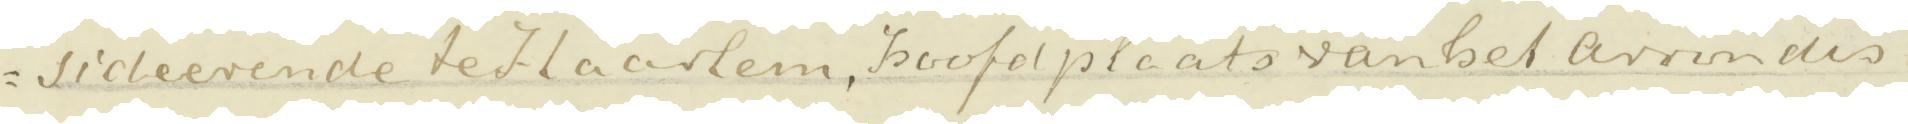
=sideerende te Haarlem, hoofdplaats van het Arrondis.
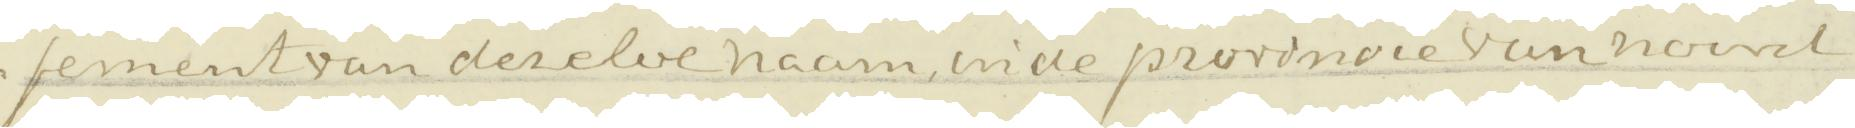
sement van dezelve naam, in de provincie van noort
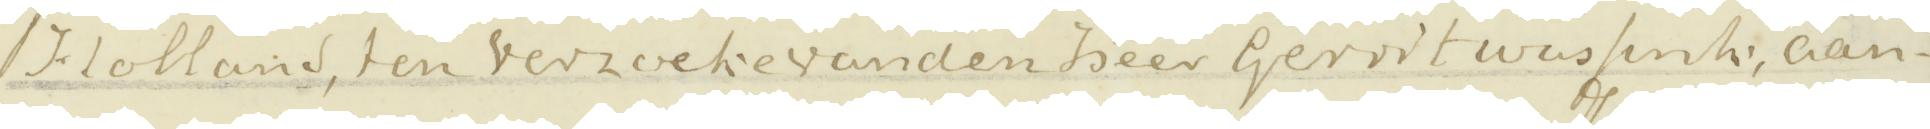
Holland, ten verzoeke van den heer Gerrit wassink; aan-
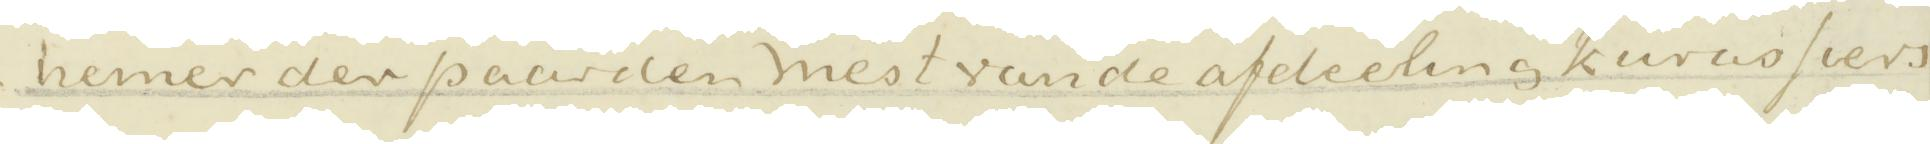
„nemer der paarden mest van de afdeeling kurassiers
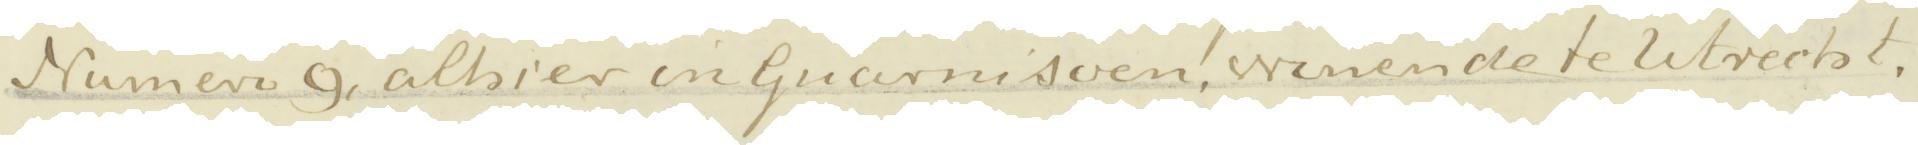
Numero 9. alhier in Guarnisoen, wonende te Utrecht,
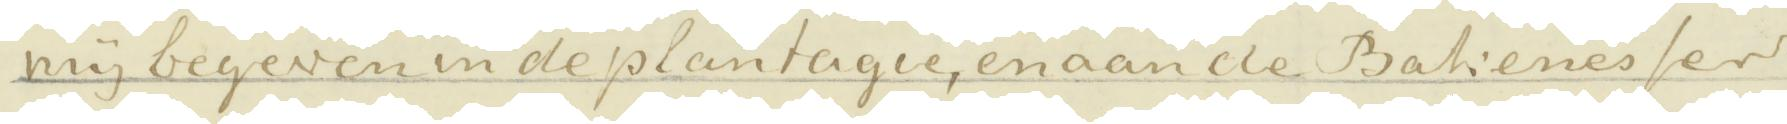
mij begeven in de plantagie, en aan de Bakenesser
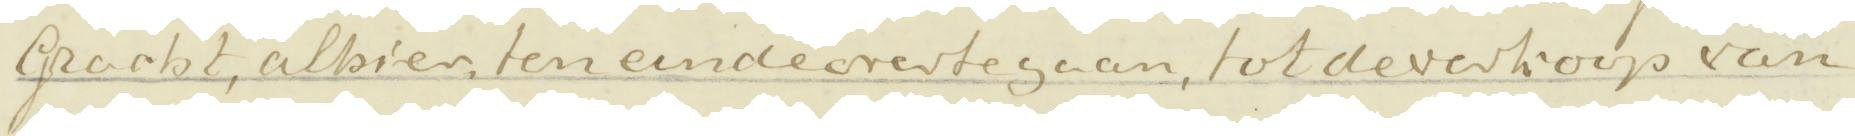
Gracht, alhier ten einde over te gaan, tot de verkoop van
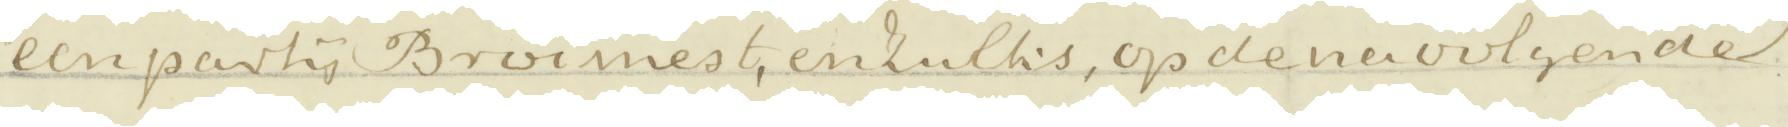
Een partij Broimest, en Zulks, op de na volgende
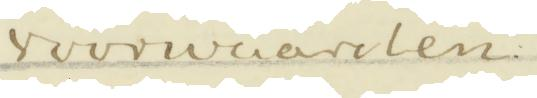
voorwaarden:
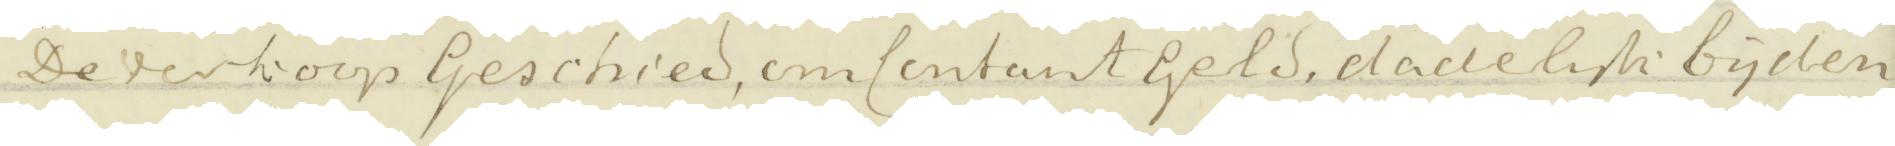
De verkoop Geschied, om Contant Geld, dadelyk bij den
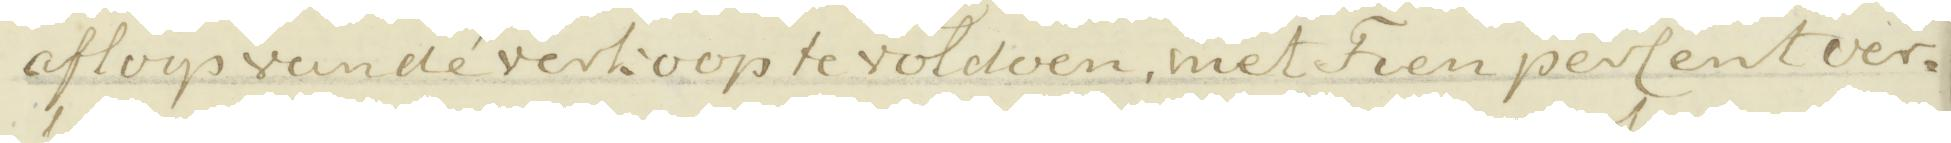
afloop van de verkoop te voldoen, met Tien percent ver=
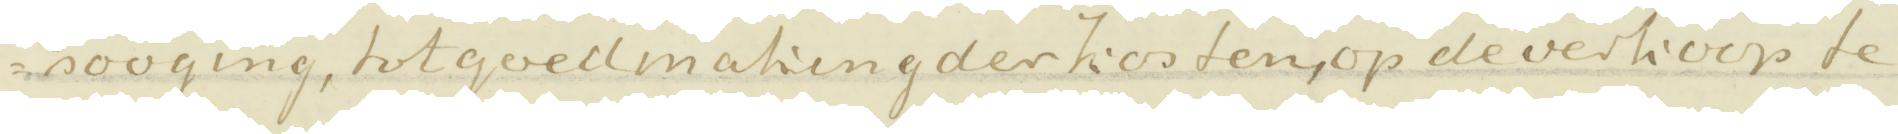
=hooging, tot goedmaking der kosten, op de verkoop te
